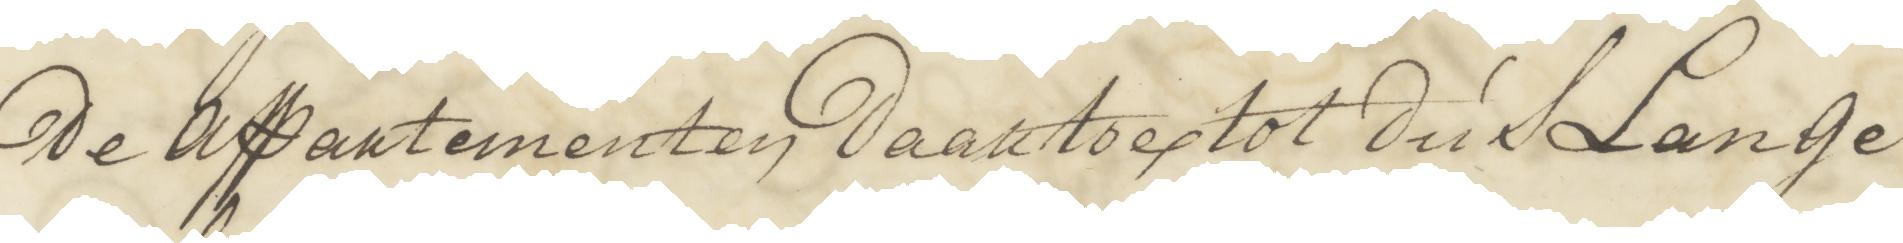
de appartementen daartoe tot dus Lange
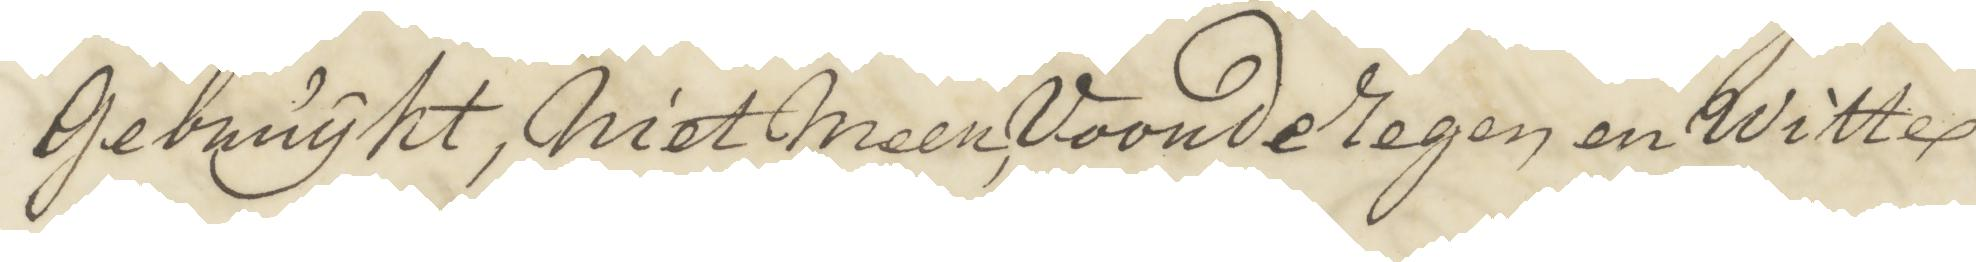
gebruijkt, niet meer, voor de regen en witte
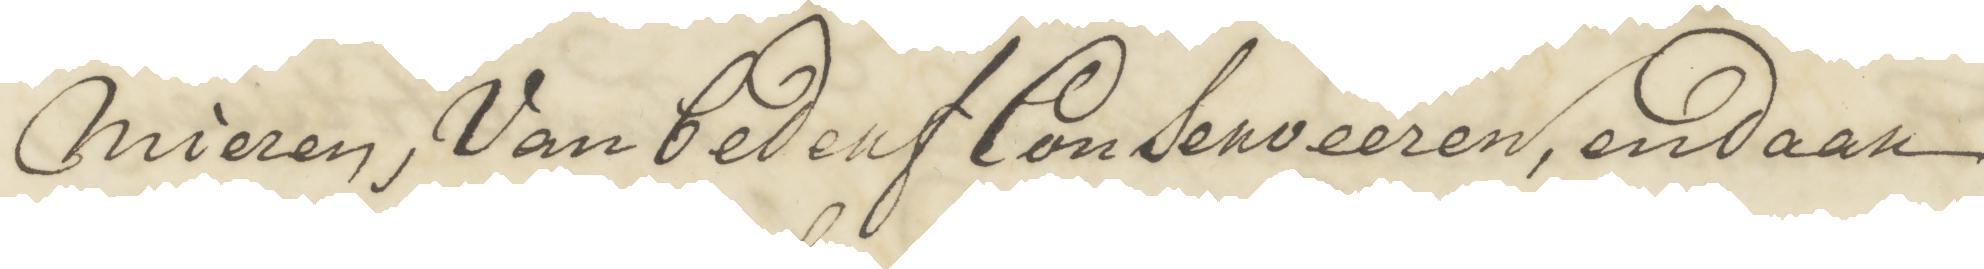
mieren, van bederf Conserveeren, en daar
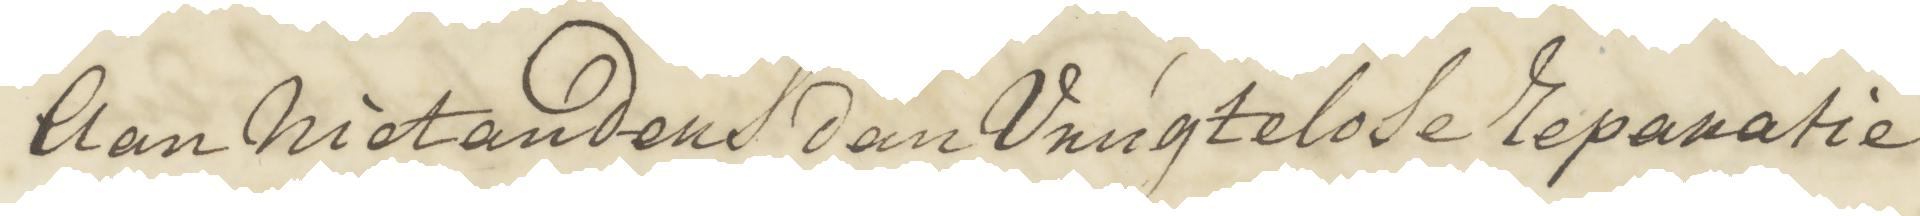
Aan niet anders dan Vrugtelose reparatie
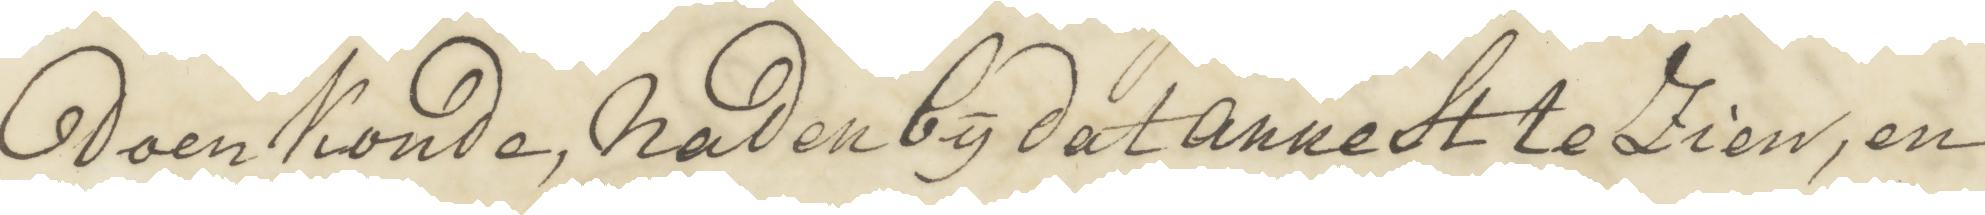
doen konde, na den bij dat arrest te zien, en
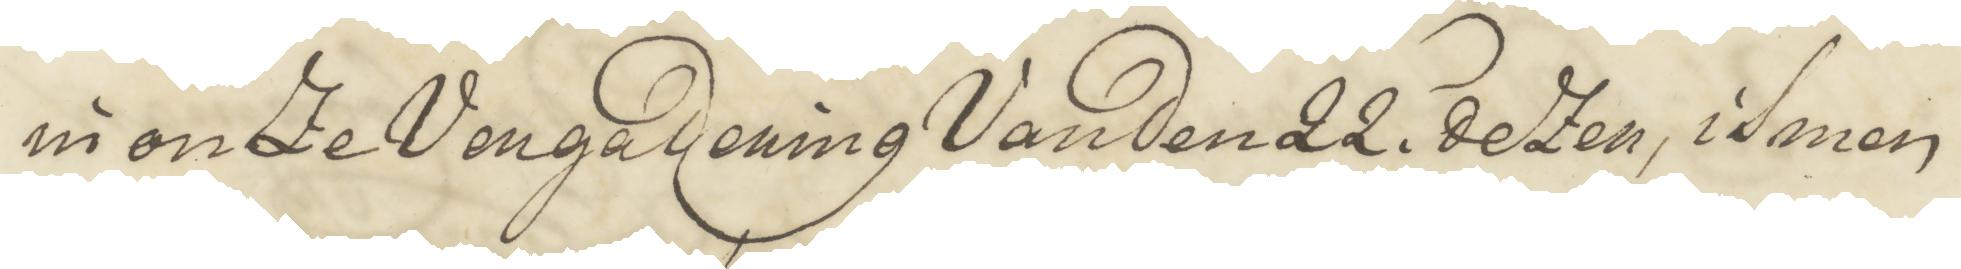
in onze Vergadering van den 22.' dezen, is men
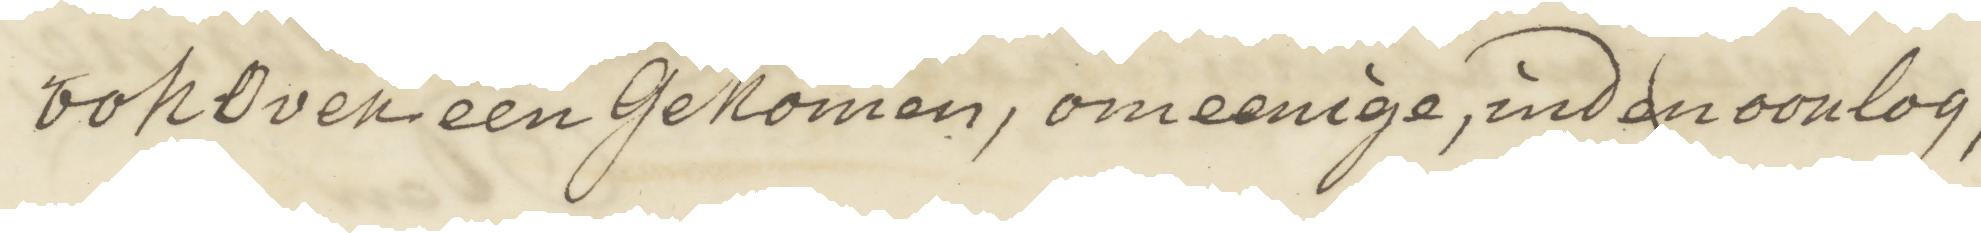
ook over een gekomen, om eenige, inden oorlog
